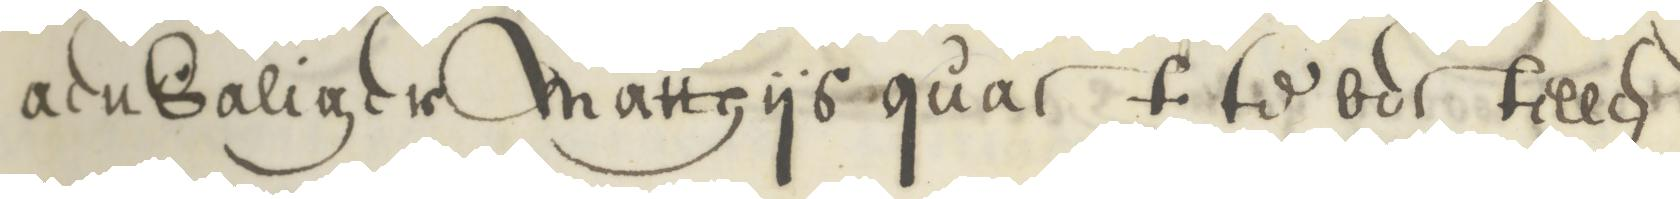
aen saliger matthijs quast te bestellen
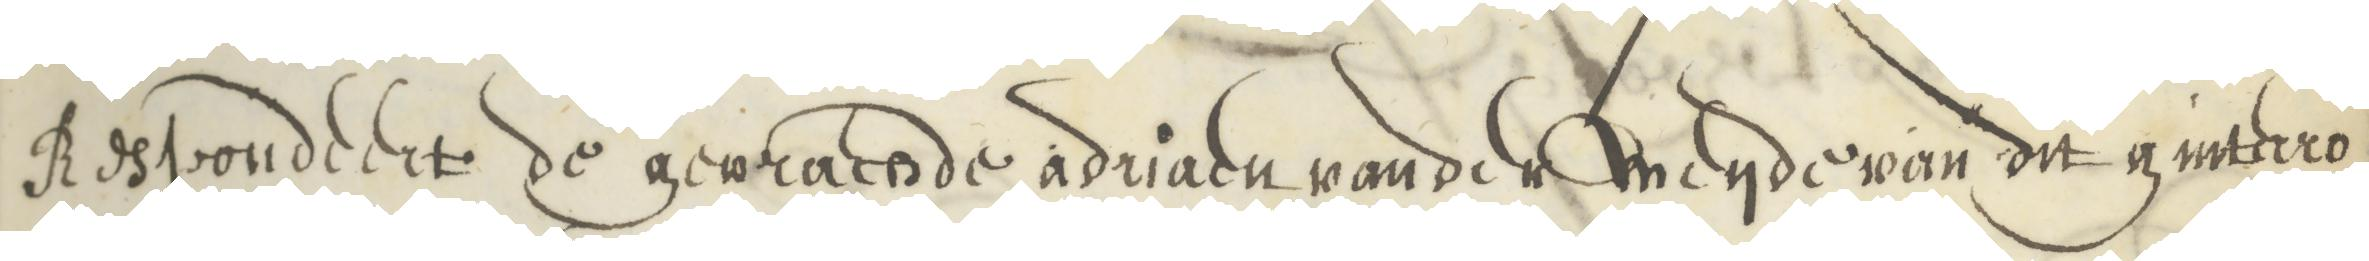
Respondeert de gevraechde adriaen van der meyde van dit ginterro
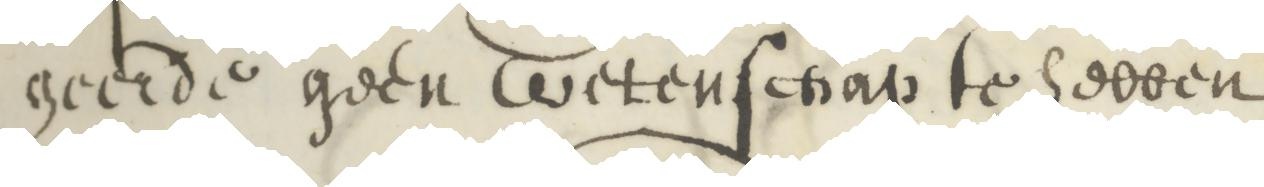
geerde geen wetenschap te hebben
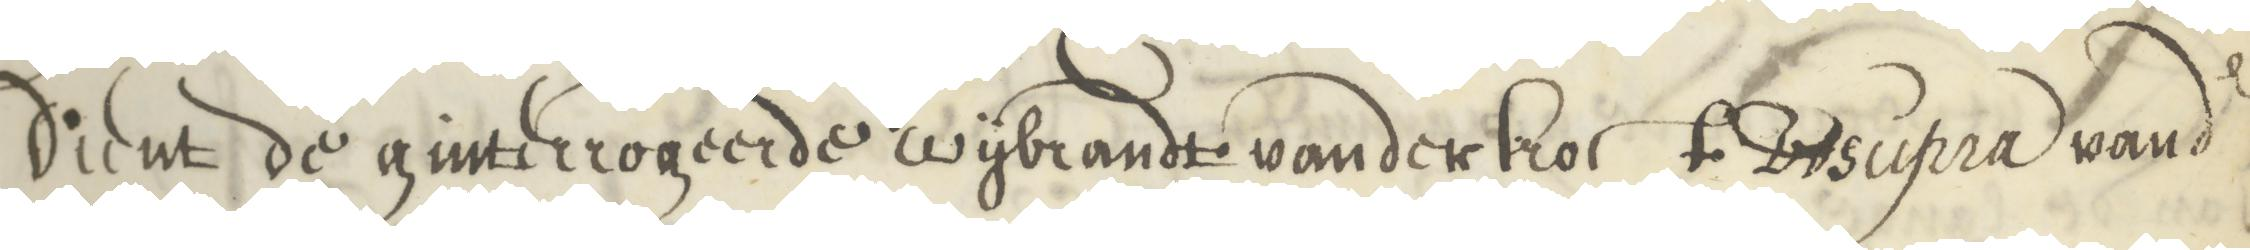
dient de ginterrogeerde wijbrandt van der kost utsupra van de
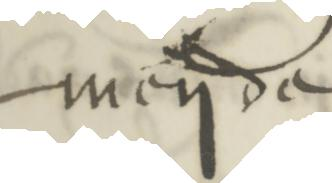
meyde
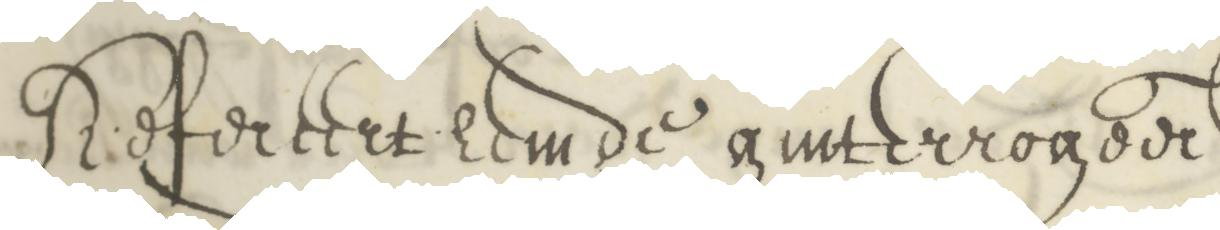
Refereert hem de ginterrogeer
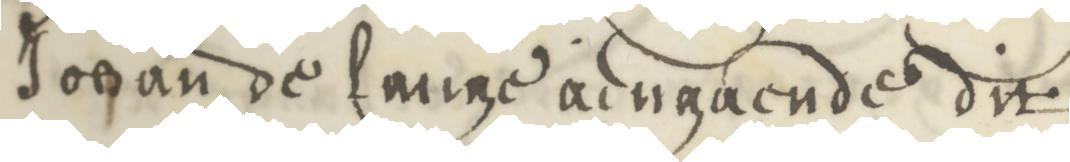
Johan de lange aengaende dit
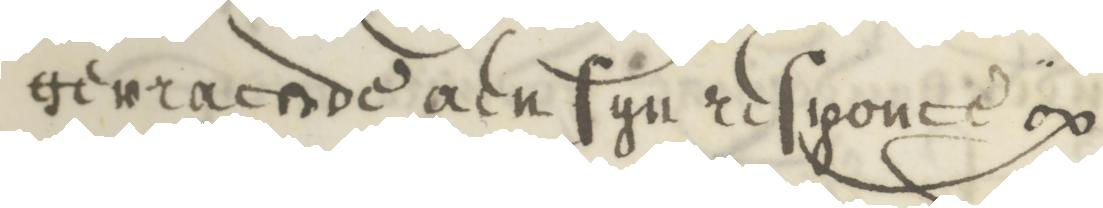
gevrachde aen sijn responce op
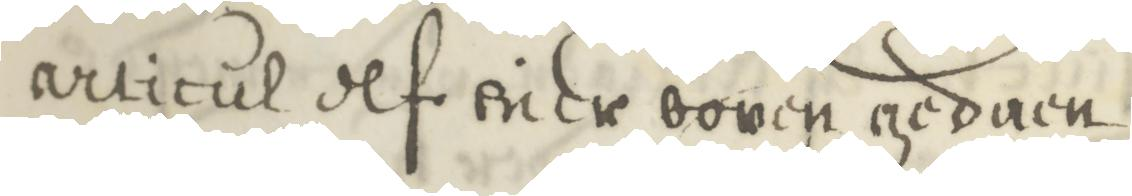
articul elf hier boven gedaen
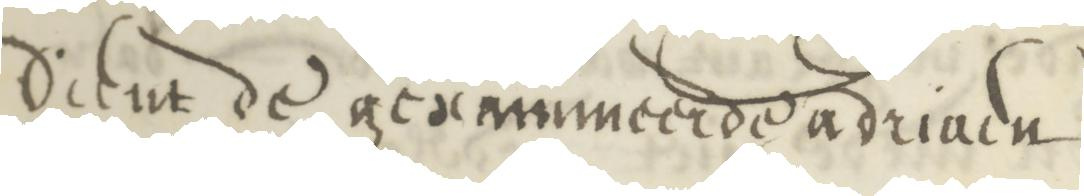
dient de gexamineerde adriaen
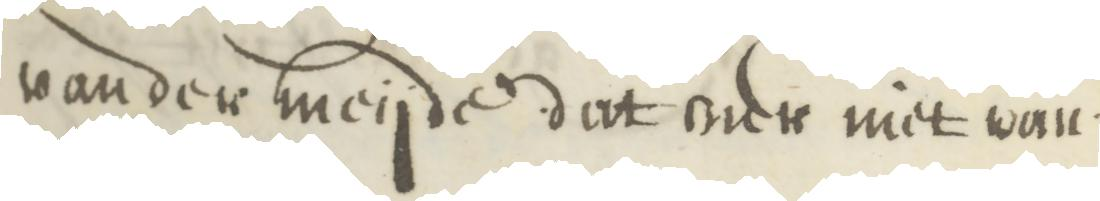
van der meijde dat hier niet van
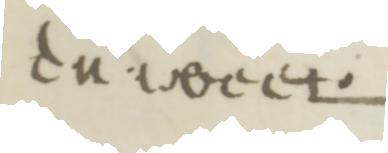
en weet
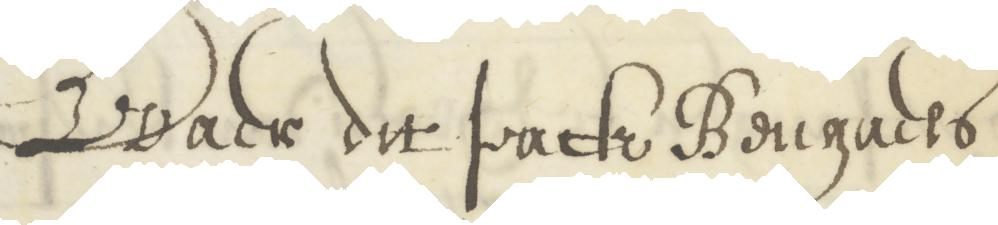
Waer dit pack Bengaels
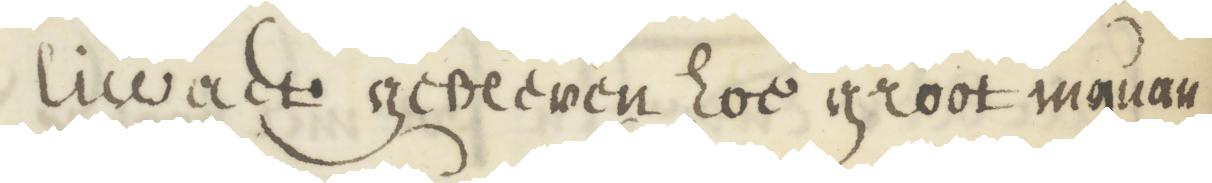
liwaet gebleven hoe groot inquar
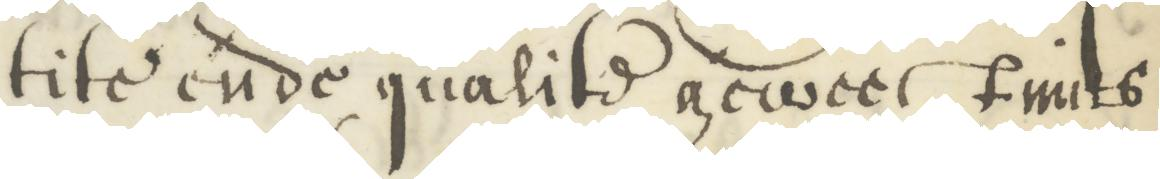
tite ende qualite geweest mits
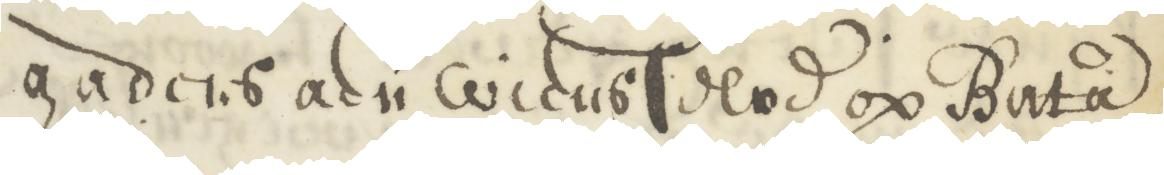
gaders aen wiensselve op Bata
